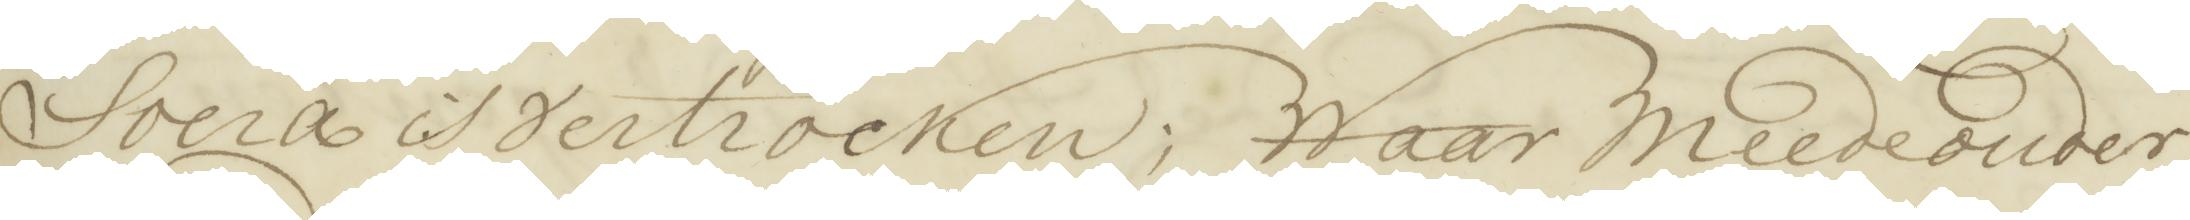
Soera is vertrocken; waar meede onder
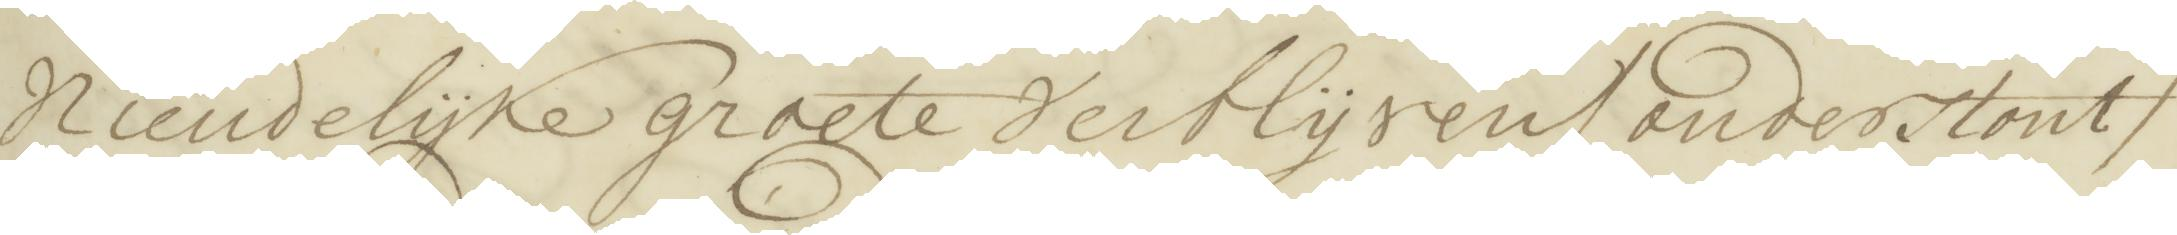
vriendelijke groete verblijven /onderstont/
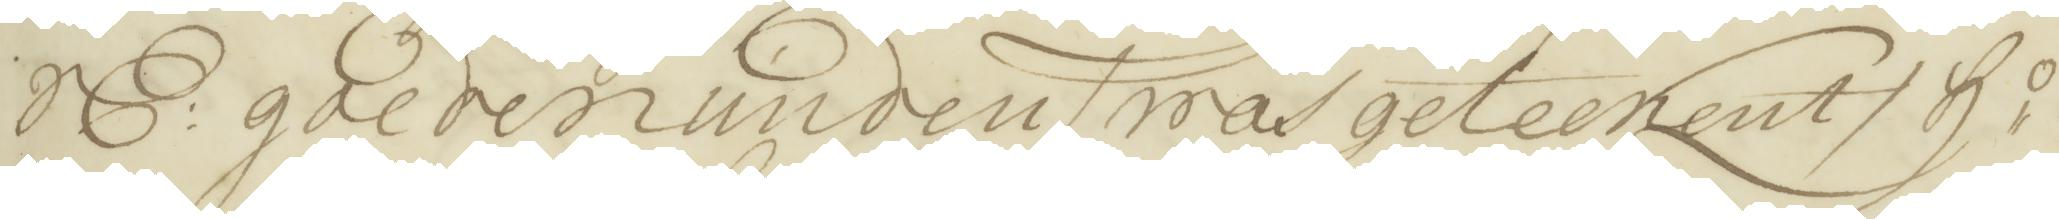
vE: goede vrunden /was geteekent/ h„o
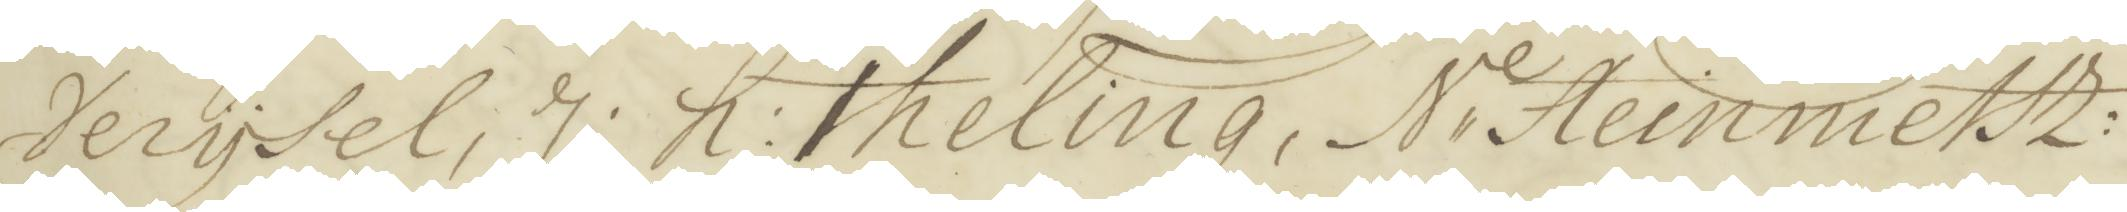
verijsel, J: h: theling, N:e steinmetsz:
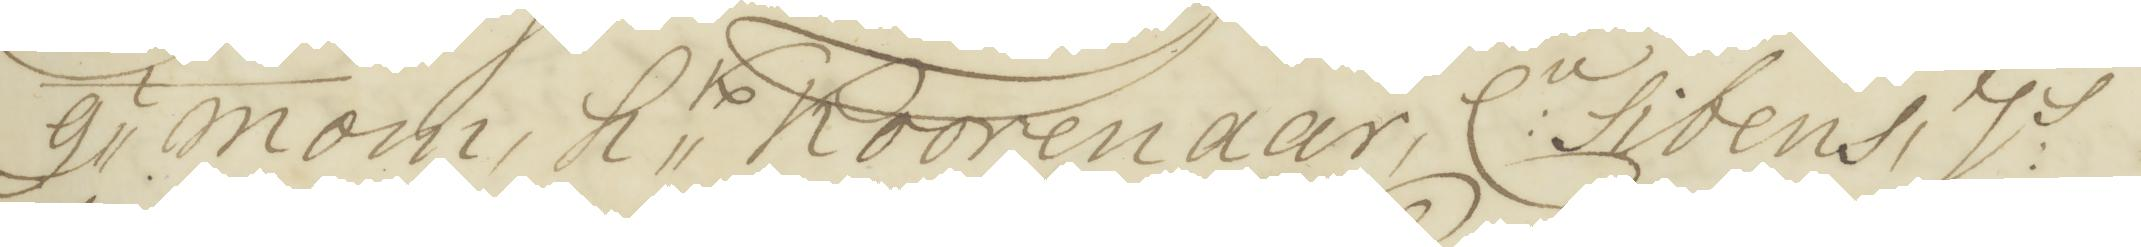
g„t mom, h„k koorenaar, C:n sibens, J:s
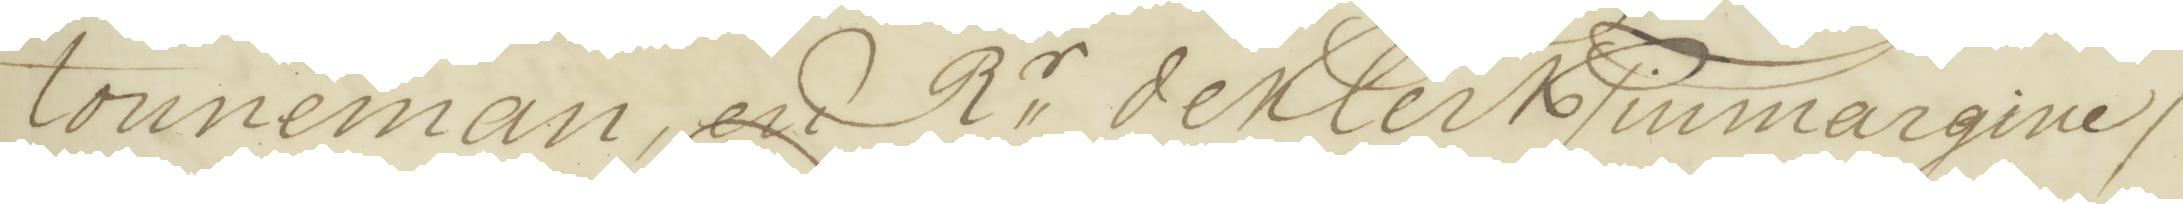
tonneman, en R„r de Klerk /inmargine/
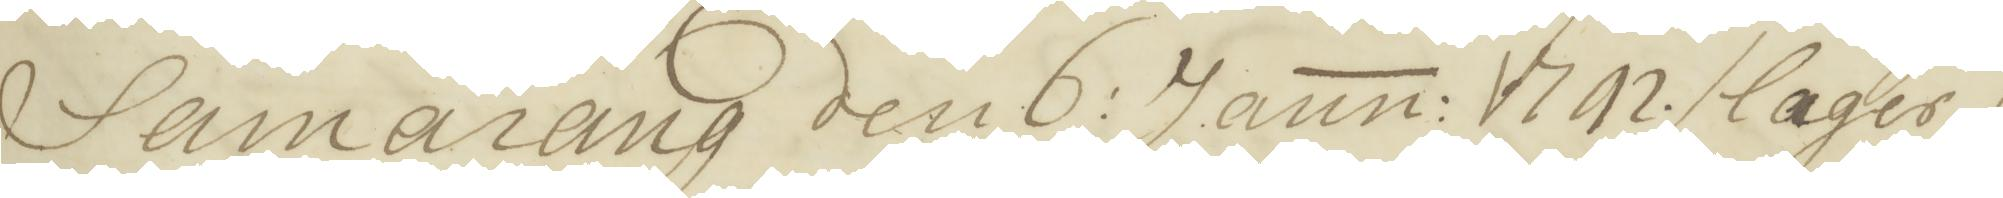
Samarang den 6: Jann: 1742. /lager/
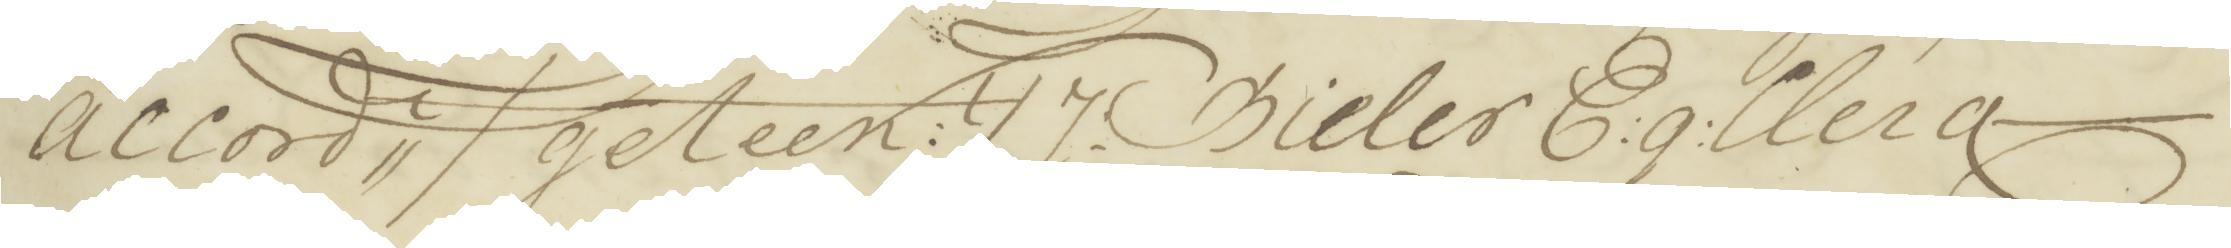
accord„t / geteek:t/ J: Bieler E: g: Clerq
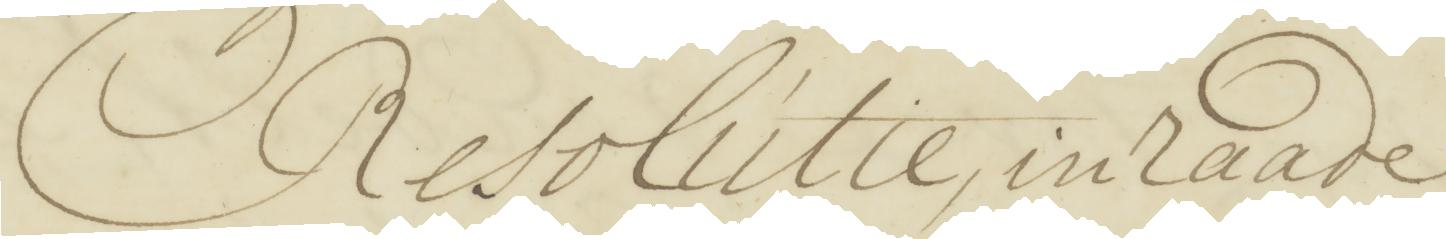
Resolutie, in raade
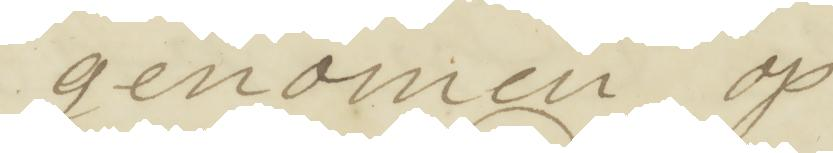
genomen op
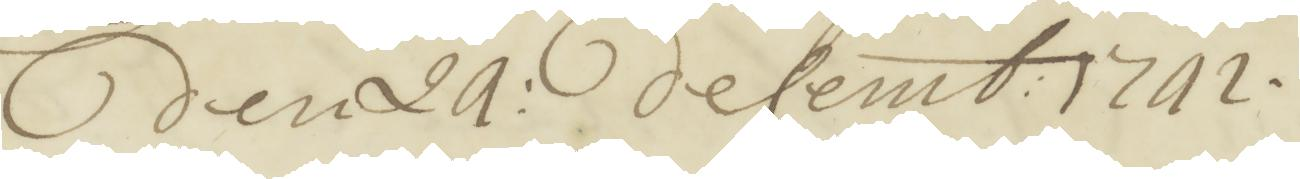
den 24: decemb: 1742.
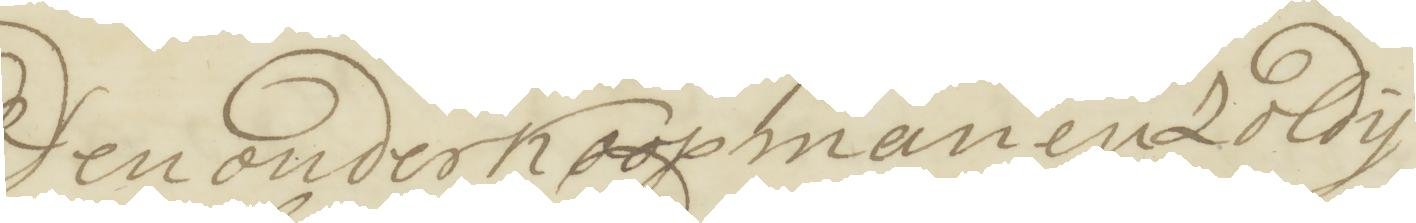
Den onderkoopman en zoldij
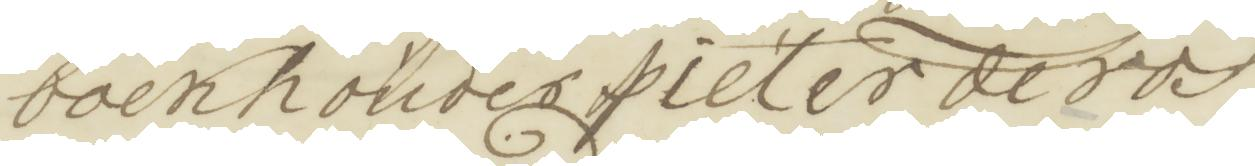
boekhouder pieter de vos
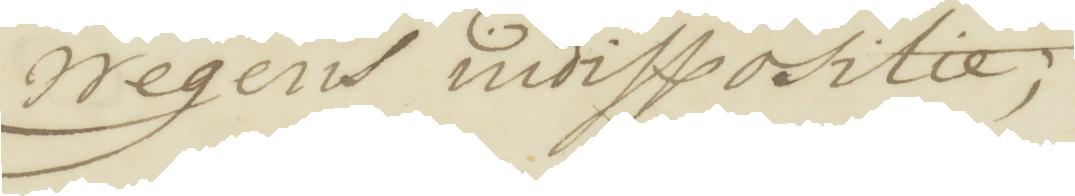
wegens indispositie;
